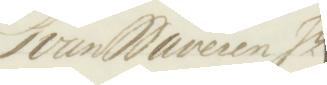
P vanWaveren Jr
